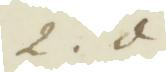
2. d
